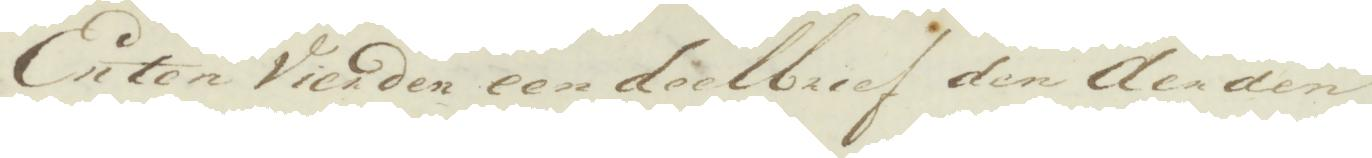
En ten Vierden een deelbrief den derden
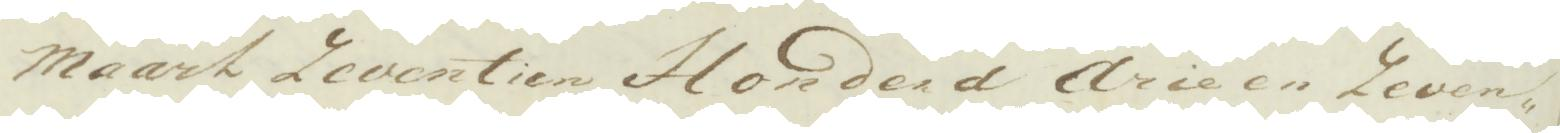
maart Zeventien Honderd drie en Zeven„
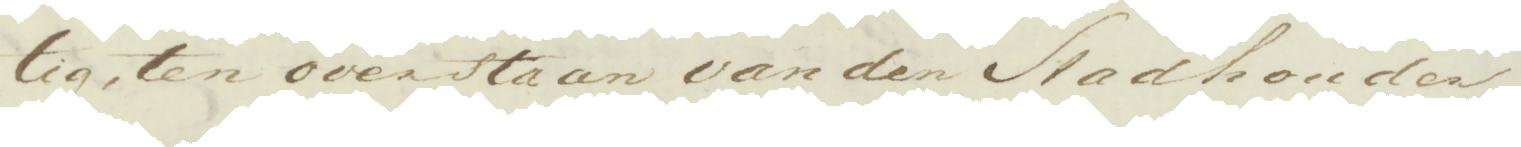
tig, ten overstaan van den Stadhouder
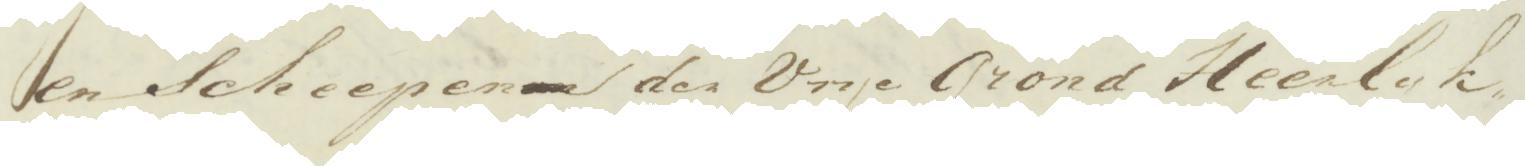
en scheepen en der Vrye Grond Heerlyk„
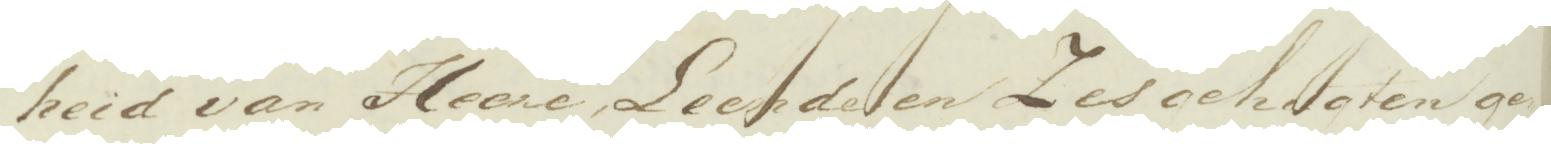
heid van Heere, Leende en Zes gehugten ge„
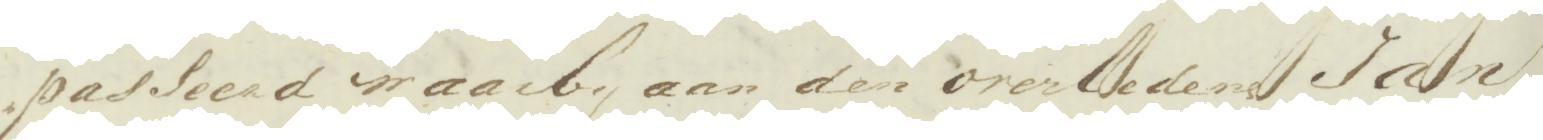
passeerd waarby aan den overledene Jan
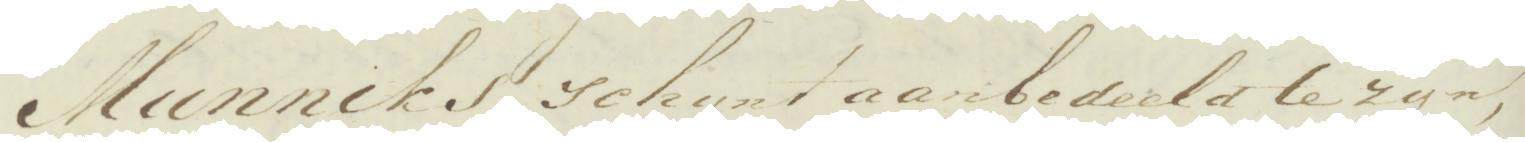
Munniks, schynt aanbedeeld te zyn,
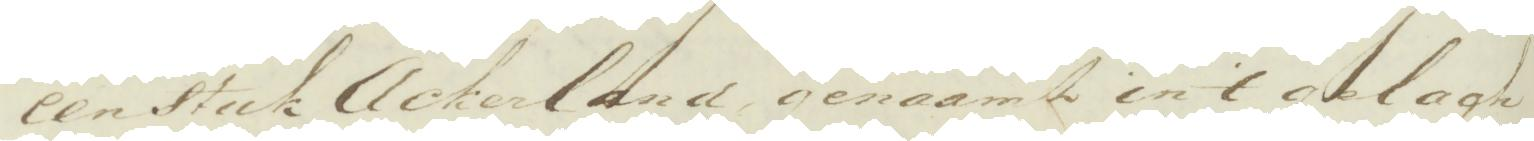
een stuk Ackerland, genaamt in ’t gelagh
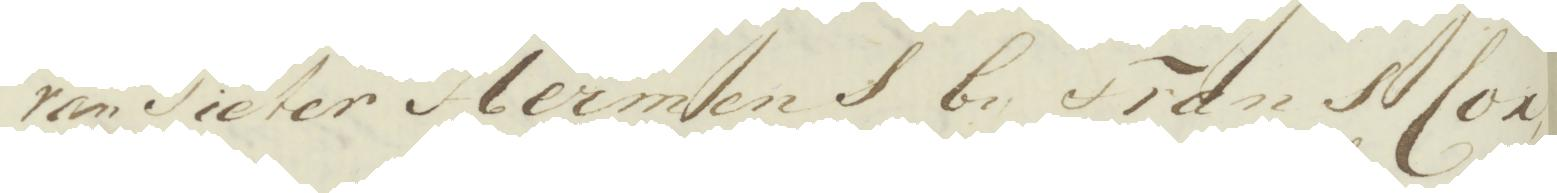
van Pieter Hermens by Frans Cor,
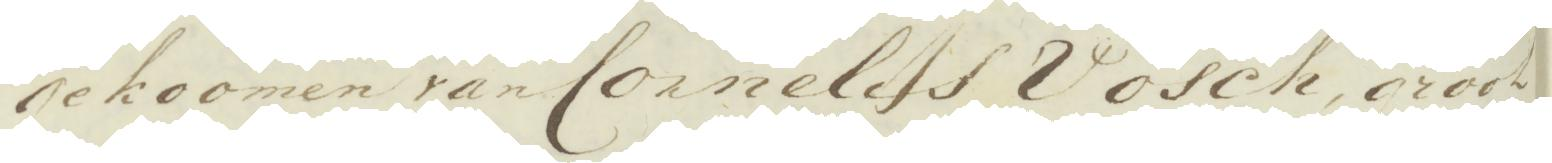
gekoomen van Cornelis Vosch, groot
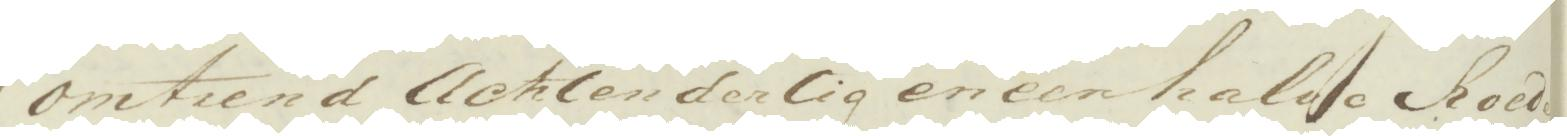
omtrend Achtendertig en een halve Roede
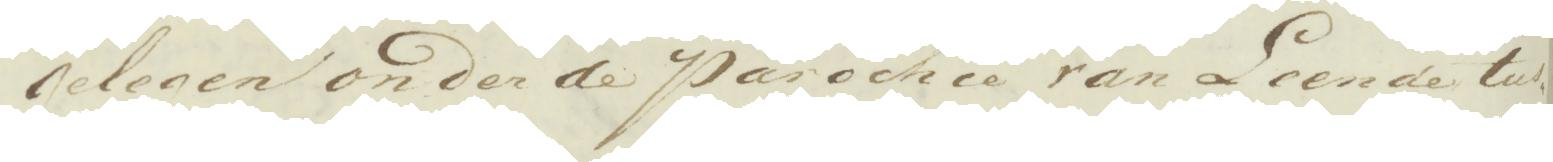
gelegen onder de parochie van Leende tus,
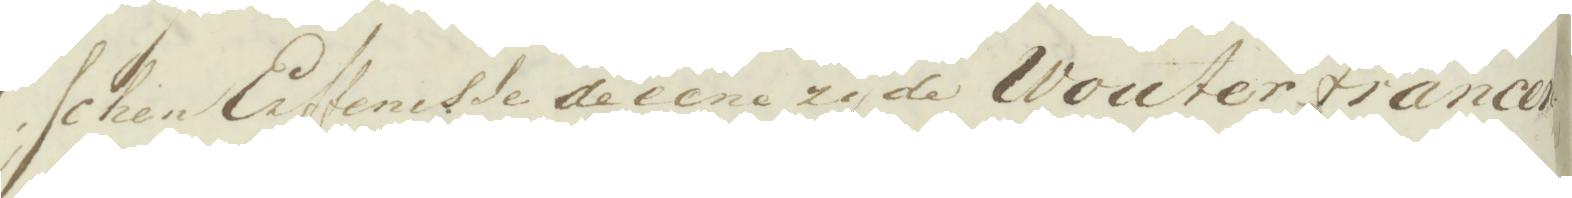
,schen Erffenisse de eene zyde Wouter France
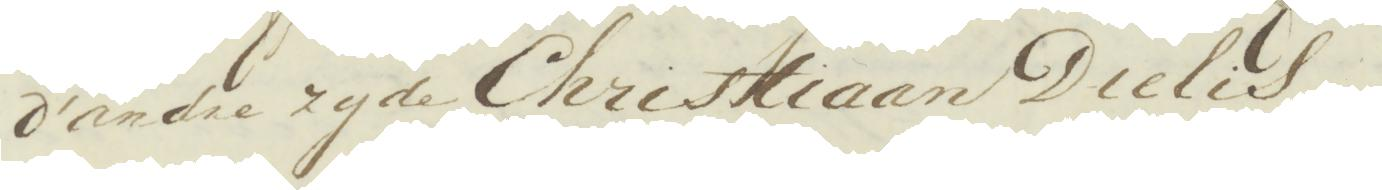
d'andre zyde Christiaan Dielis.
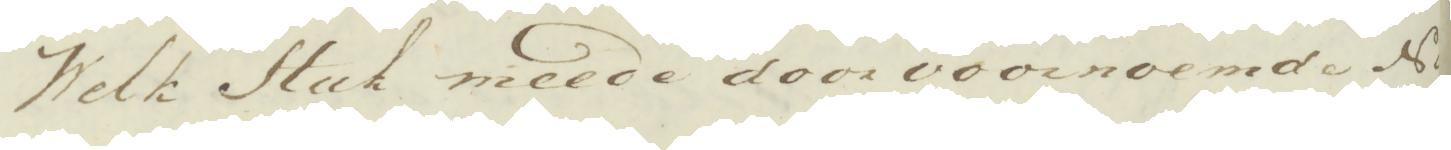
Welk stuk meede door voornoemde No
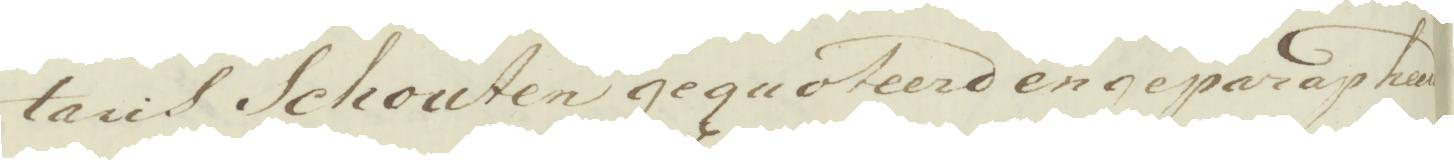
taris Schouten gequoteerd en geparaphee
